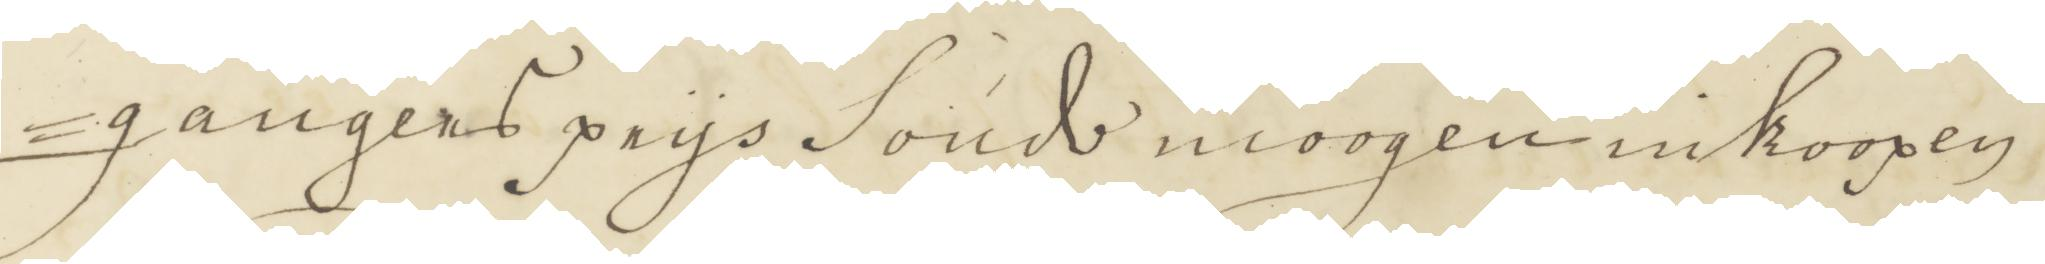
=gangers prijs soude moogen inkoopen
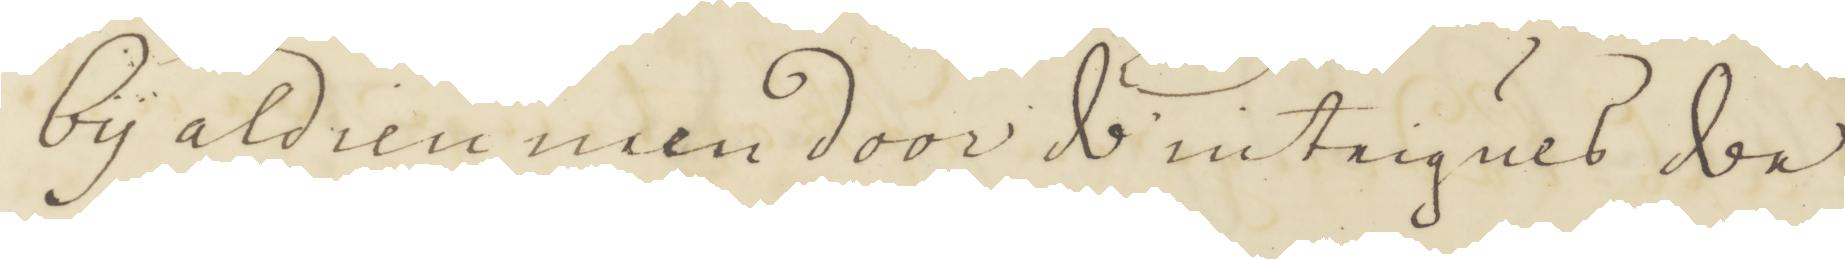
bij aldien men door de intrigues der
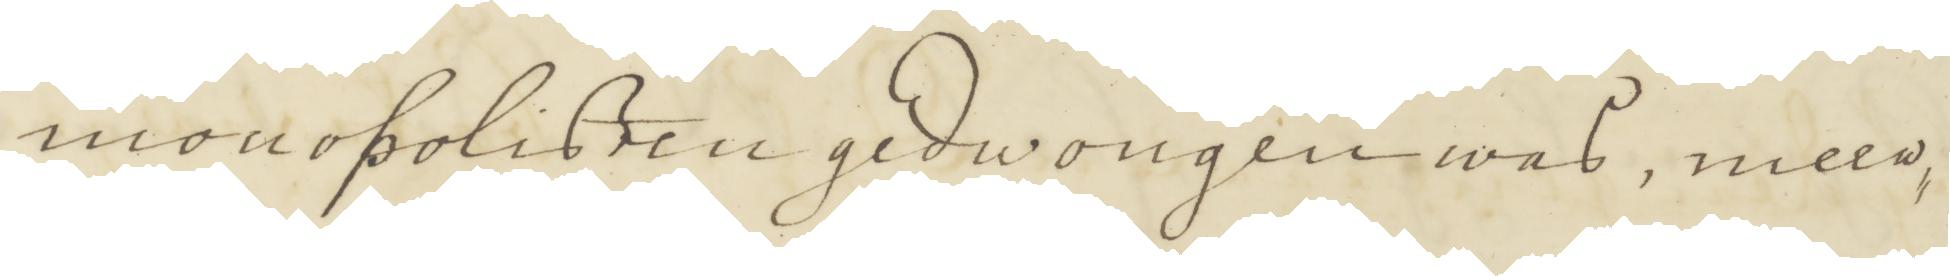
monopolisten gedwongen was, meer„
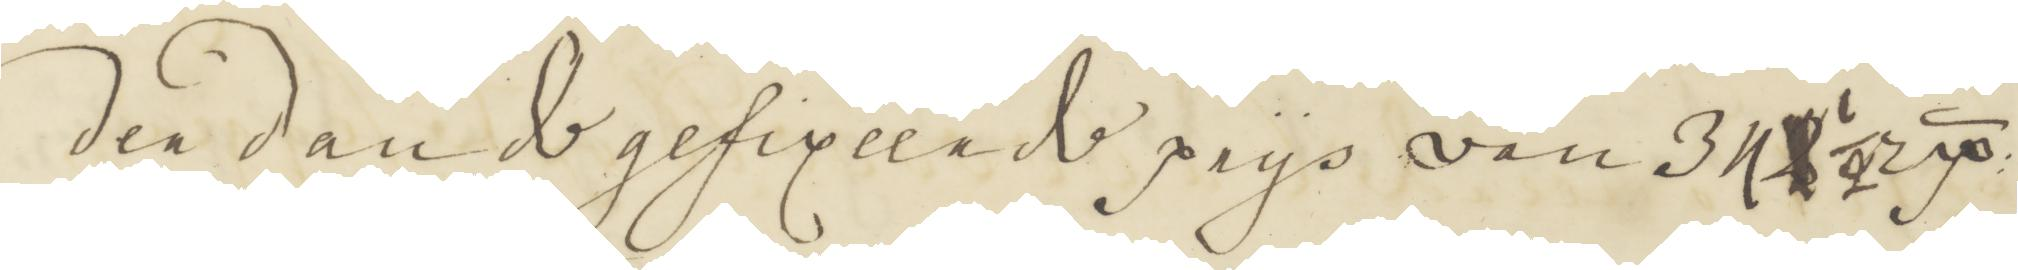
der dan de gefixeerde prijs van 34½ rp:
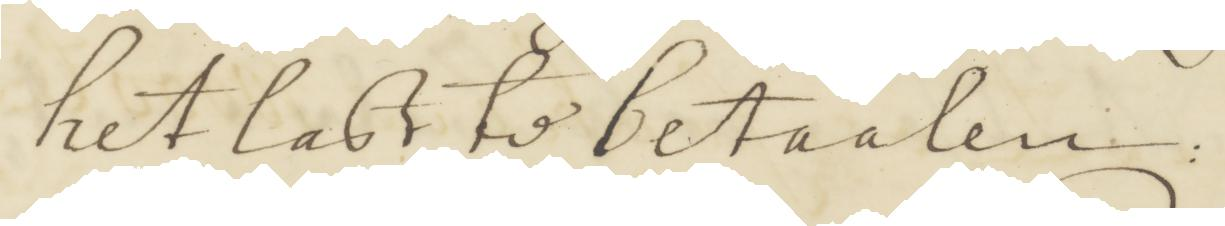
het last te betaalen:
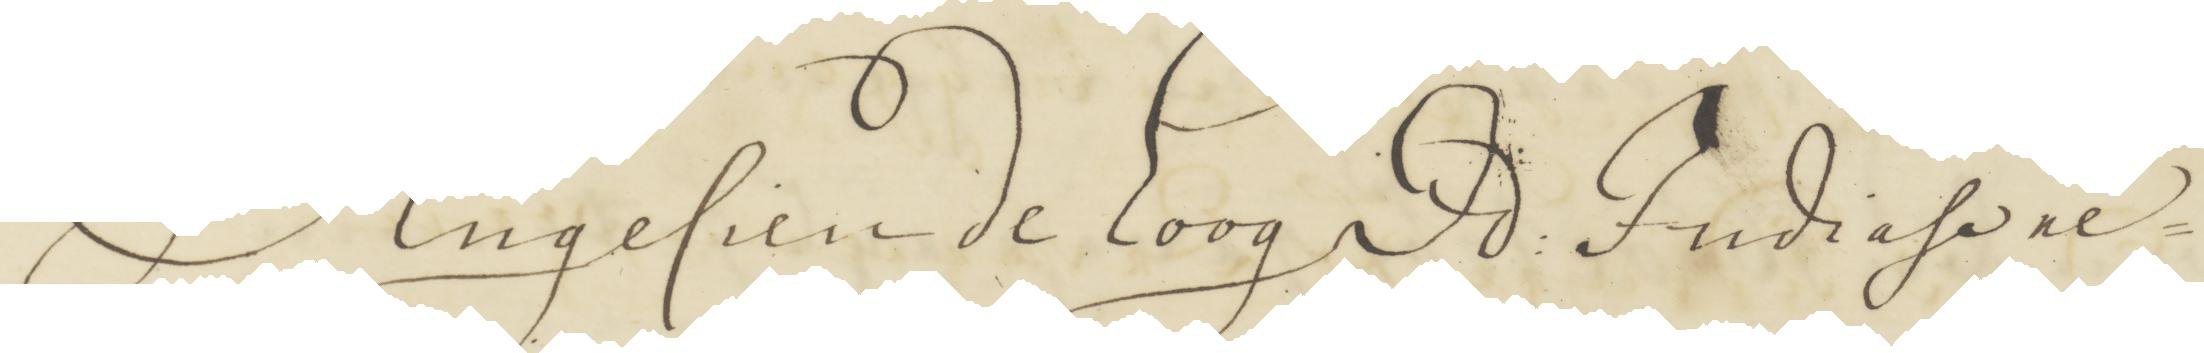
Angesien de hoog Ed: Indiase re=
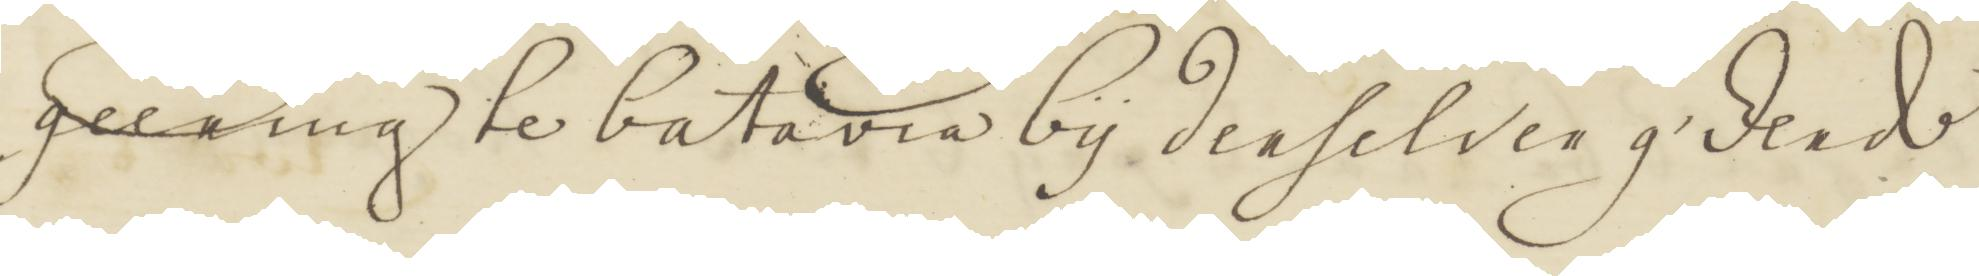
geering te batavia bij derselver g’Eerde
